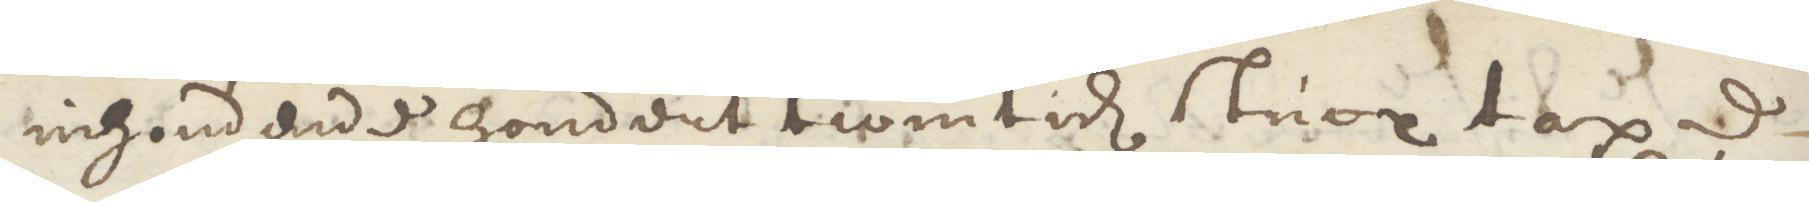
inhoudende hondert twintich stucx t op D —
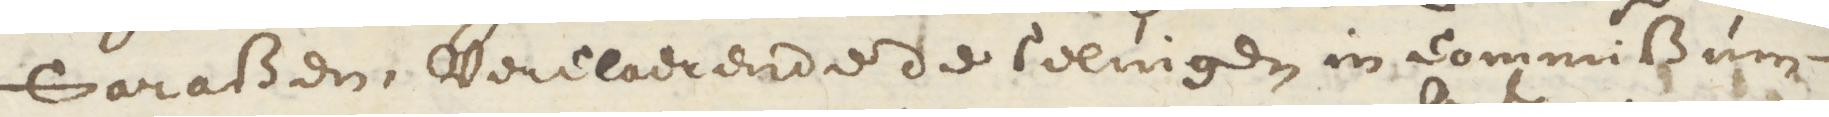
Saraszen, Verclaerende de selvigen in Commiszum —
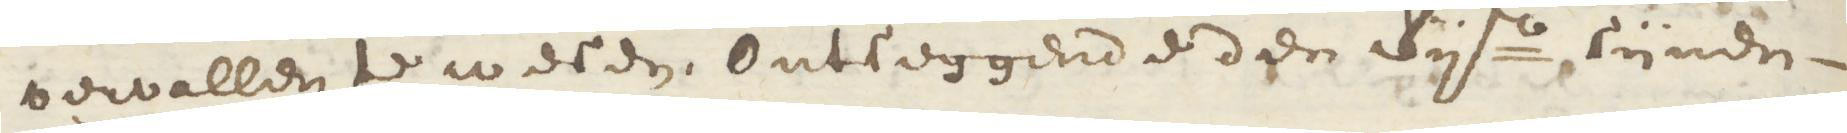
vervallen te wesen, Ontseggende den Eij=r sijnen —
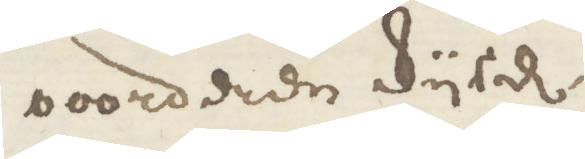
voorderen Eijsch —
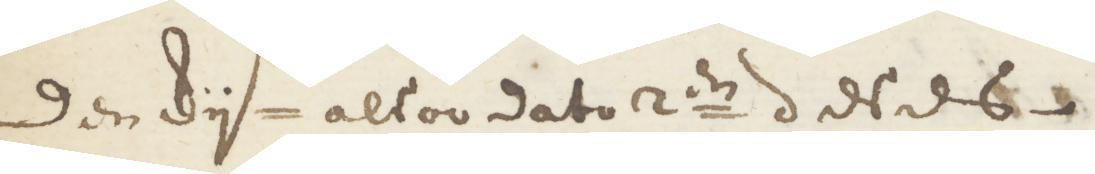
Den Eij=r alsoo dato 2=en deses —
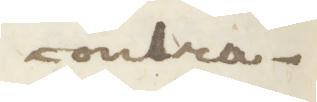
contra —
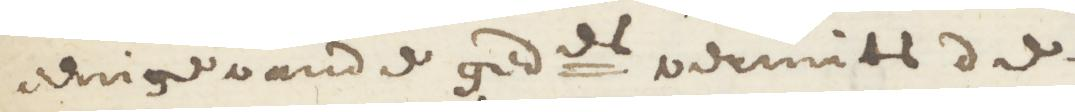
eenige vande ged=es vermits de —
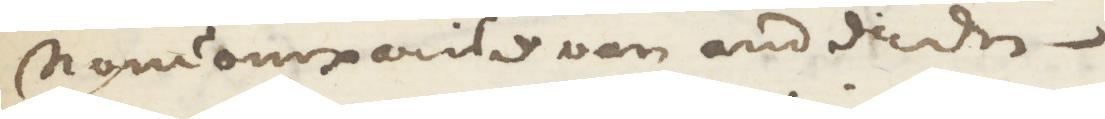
Non Comparise van anderen —
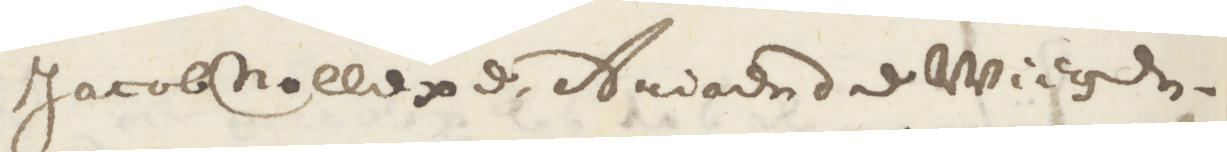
Jacob Nollepe, Ardaen de Wiegen —
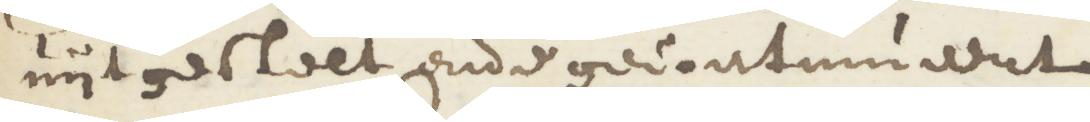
uijt gestelt ende gecontinueert
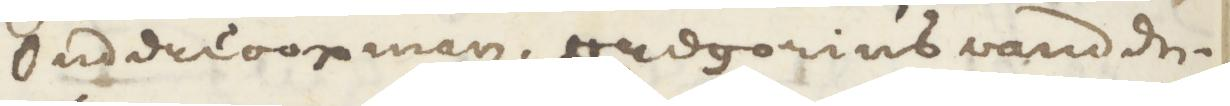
Ondercoopman, gregorius vanden —
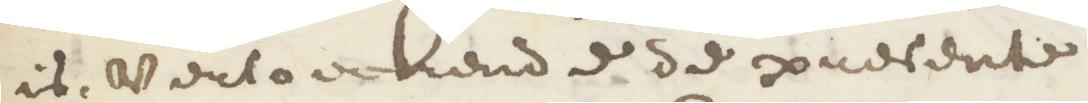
is. Versoeckende de presente
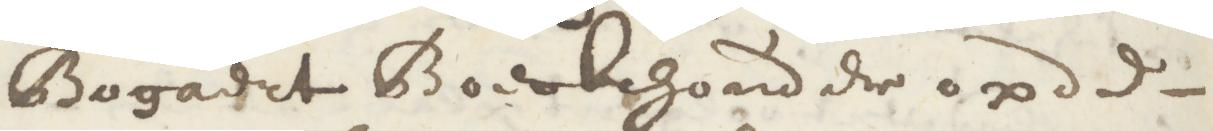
Bogaert Boeckhouder opde —
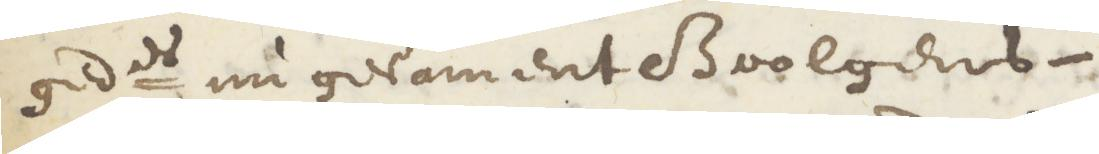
ged=es nu gesamentlijk volgens —
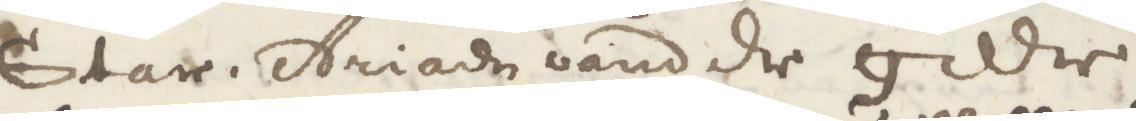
Star. Ariaen vander geer
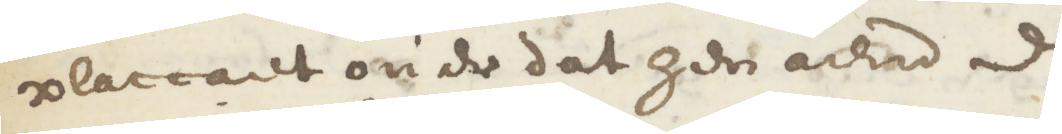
placcaet over dat hen aend e
